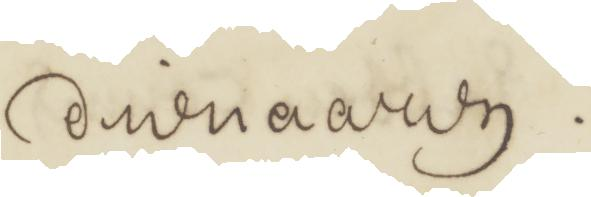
dienaaren
